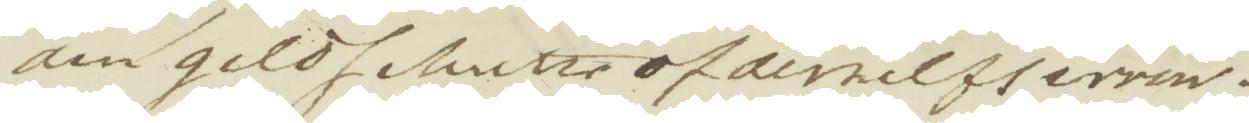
den geldschieter of deszelfs erven
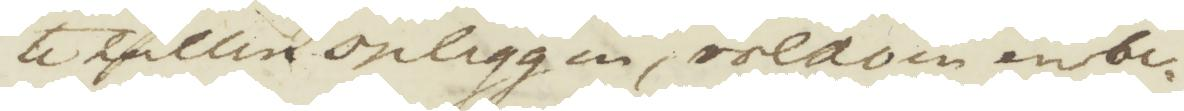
te zullen opleggen, voldoen en be„
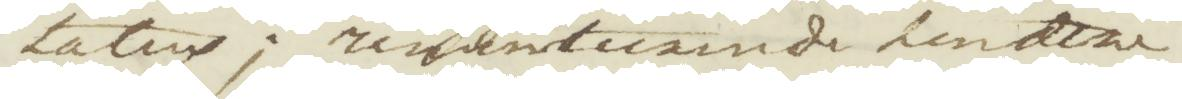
talen; renuntierende ten deze
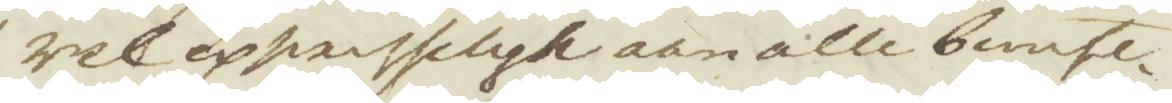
wel expresselijk aan alle benifi„
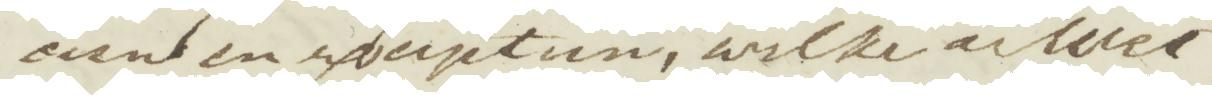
cien en exeptien, welke de wet
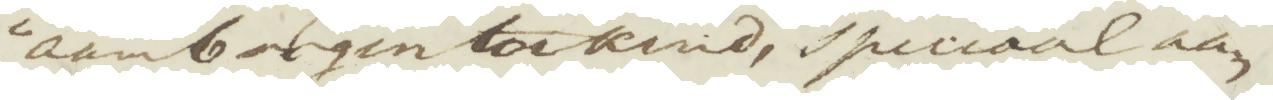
aan borgen toekend, speciaal aan
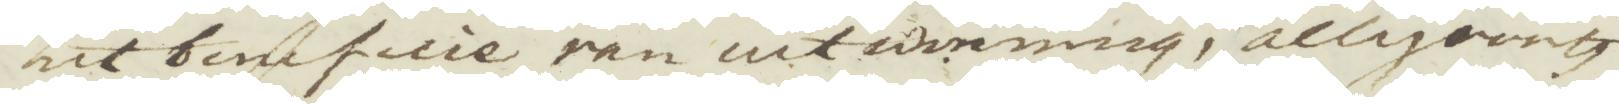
het beneficie van uitwoning, alles voorts
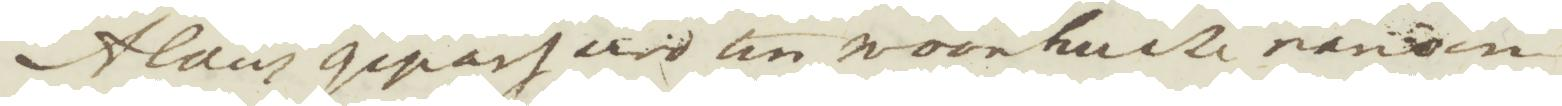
Aldus gepasseerd ten woonhuize van den
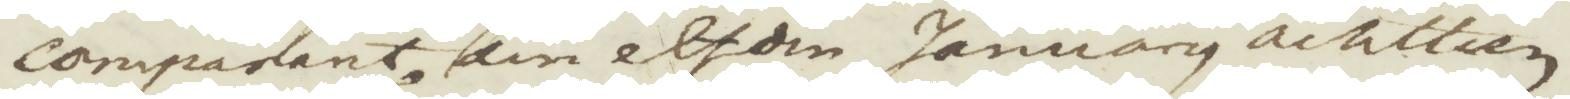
comparant, den elfden January achttien
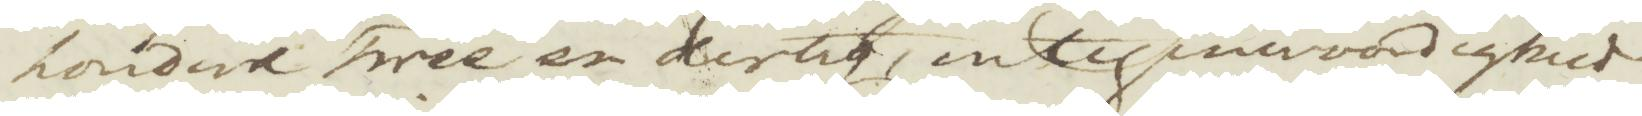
honderd Twee en dertig, in tegenwoordigheid
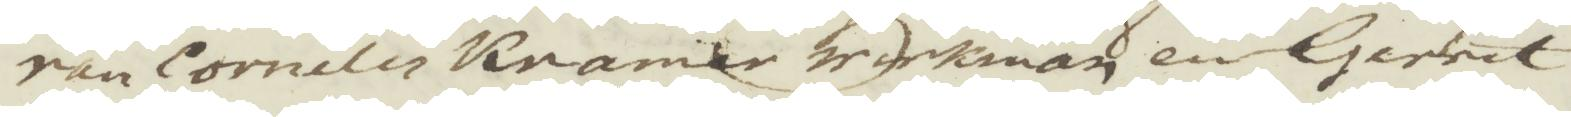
van Cornelis Kramer werkman en Gerrit
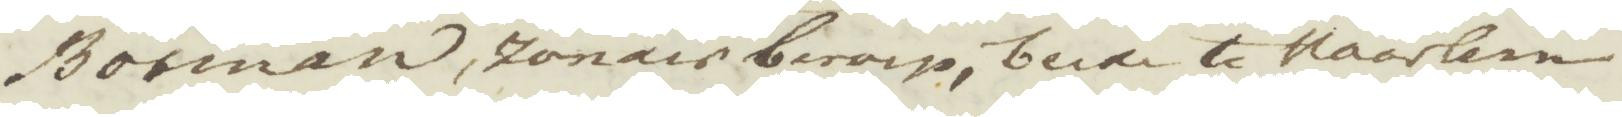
Bolman, zonder beroep, beide te Haarlem
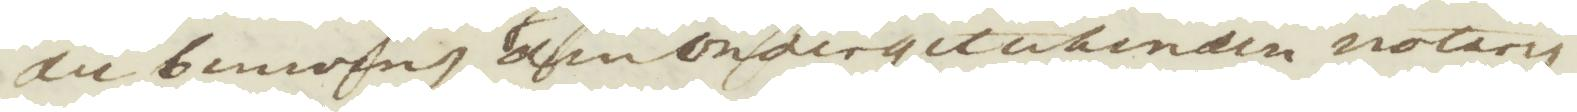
die benevens den ondergetekenden notaris
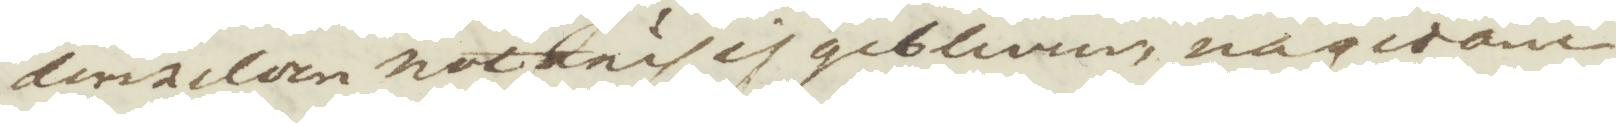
denzelven notaris is gebleven, na gedane
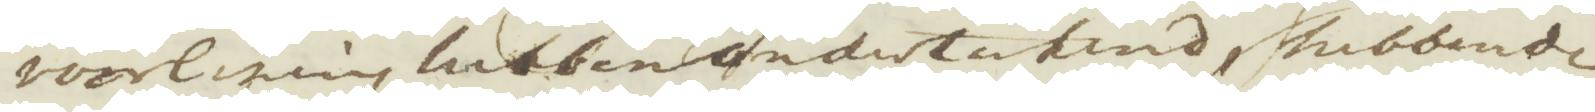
voorlezing hebben ondertekend, hebbende
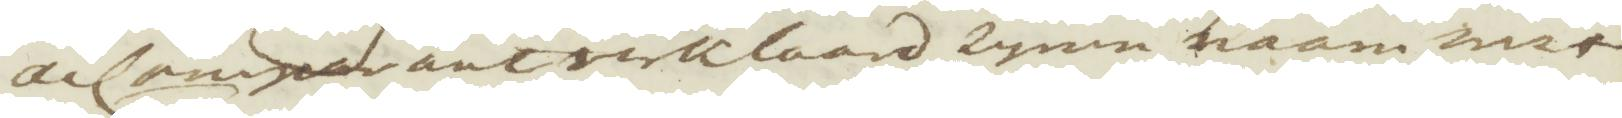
de Comparant verklaard zynen naam niet
